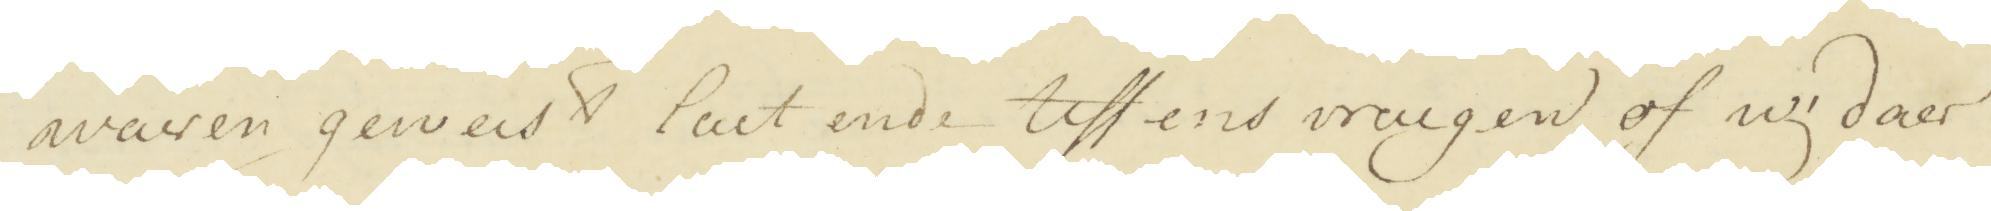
waren geweest laet ende teffens vraegen of w' daer
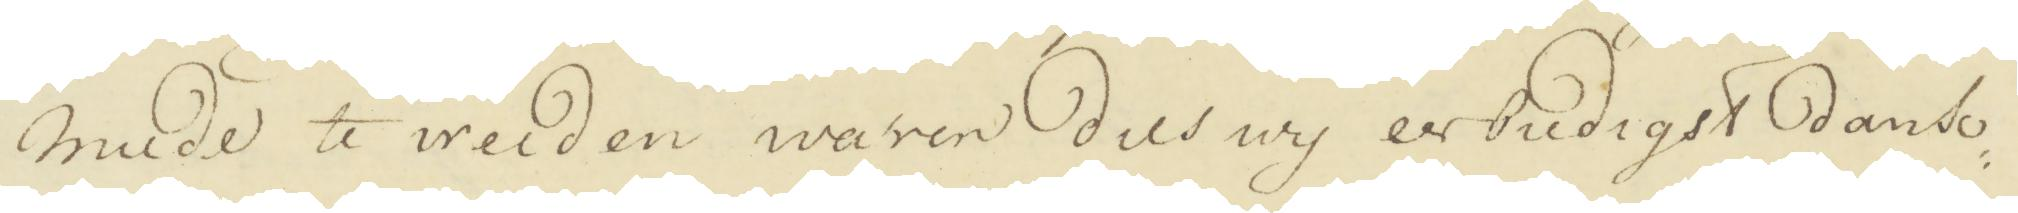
meede te vreeden waren dies wy erbiedigst dank„
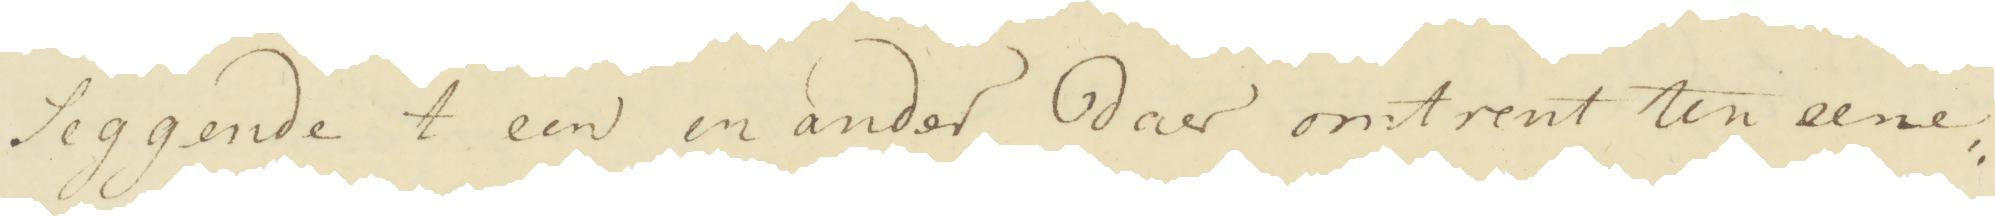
Seggende ’t een en ander daer omtrent ten eene„
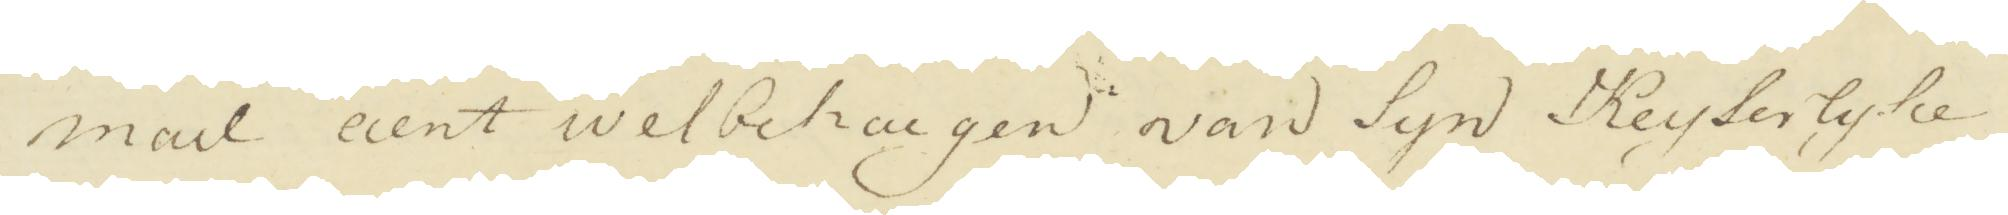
mael aent welbehaegen van Syn Keyserlyke
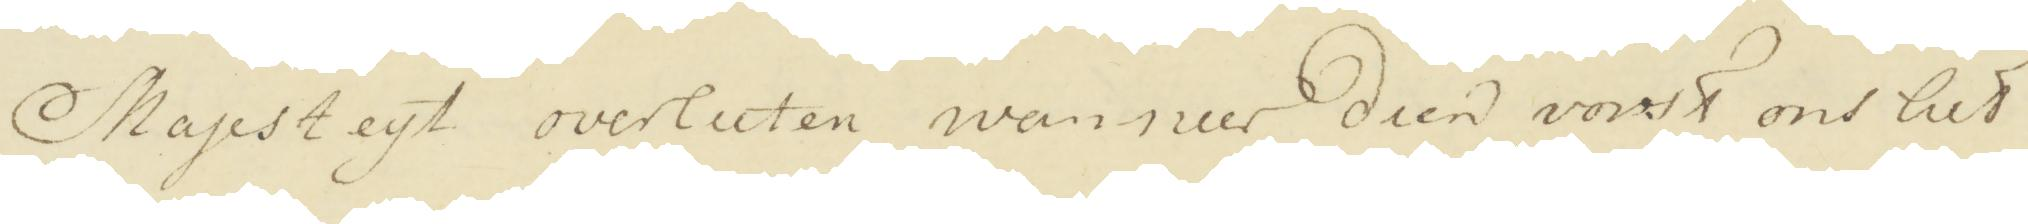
Majesteyt overlieten wanneer dien vorst ons het
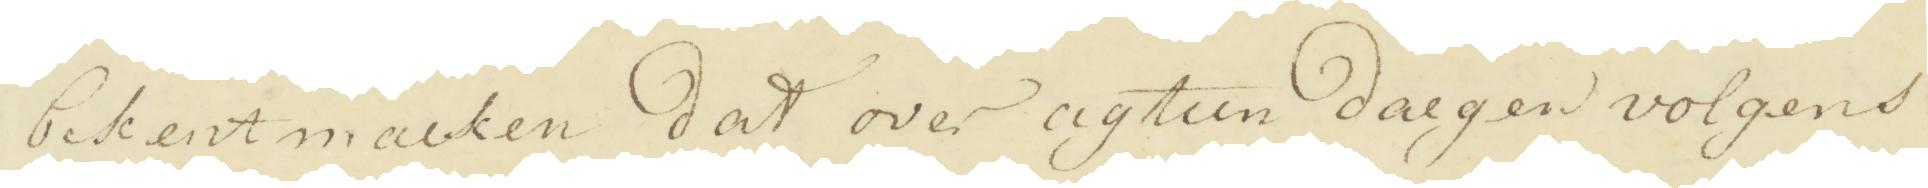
bekent maeken dat over agtien daegen volgens
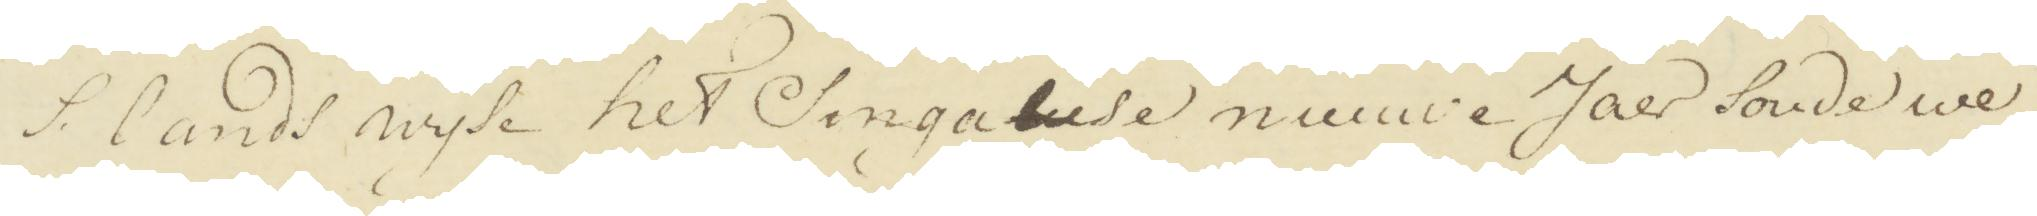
S: lands wyse het Singaleese nieuwe Jaer Soude we
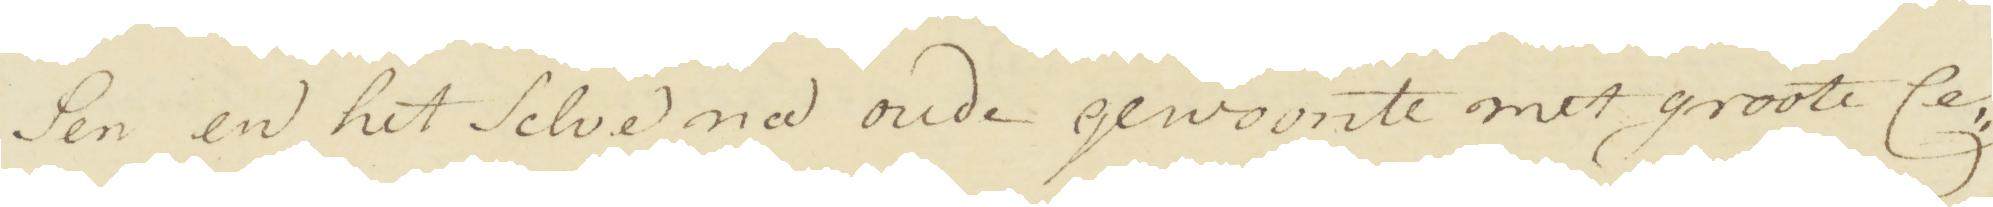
Sen en het Selve na oude gewoonte met groote Ce„
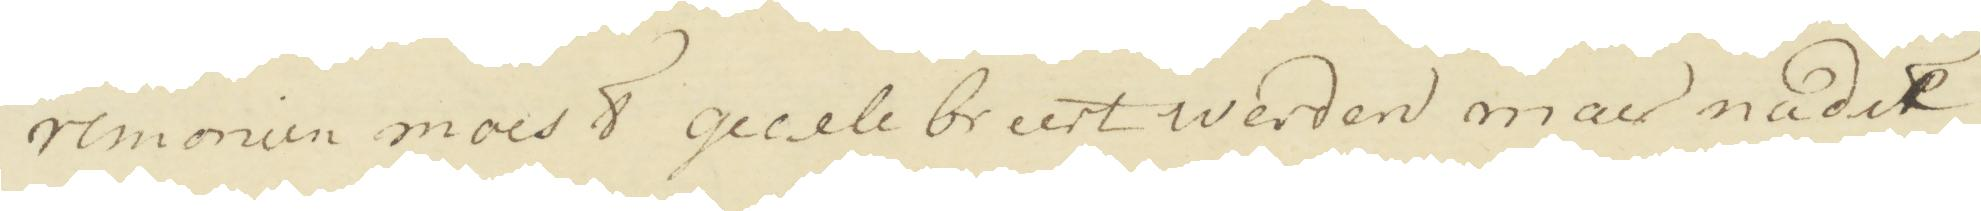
remonien moest gecelebreert werden maer na dit
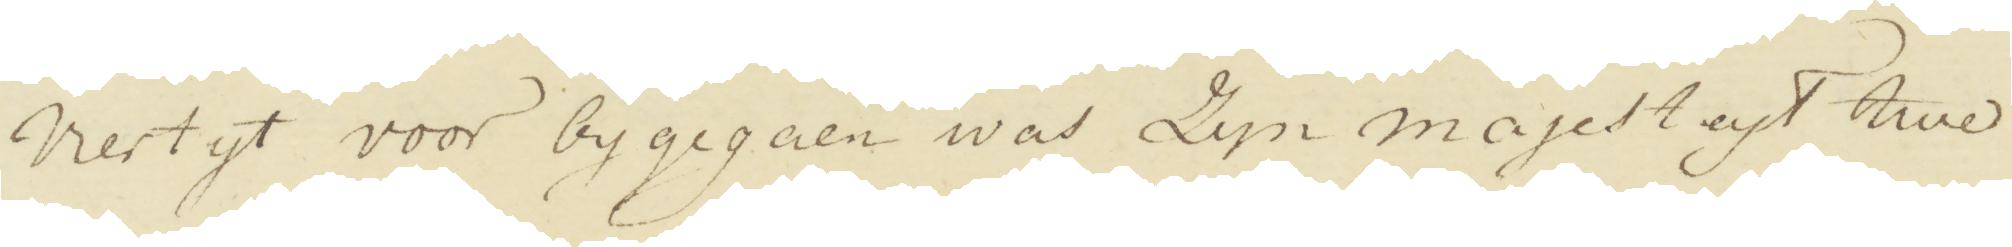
viertyt voor by gegaen was Zyn majesteyt twe
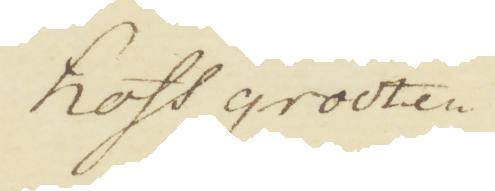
hofs grooten
